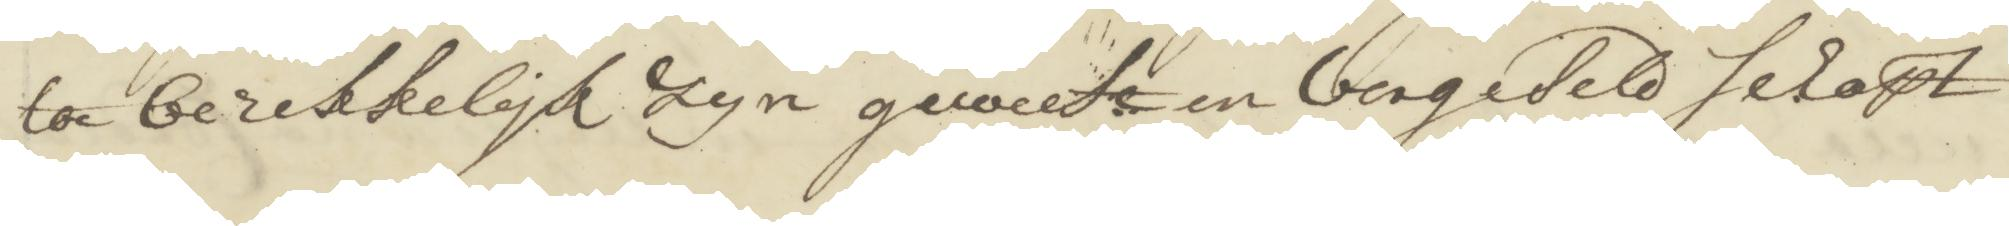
toe berekkelijk zyn geweest en Vergeseld schapt
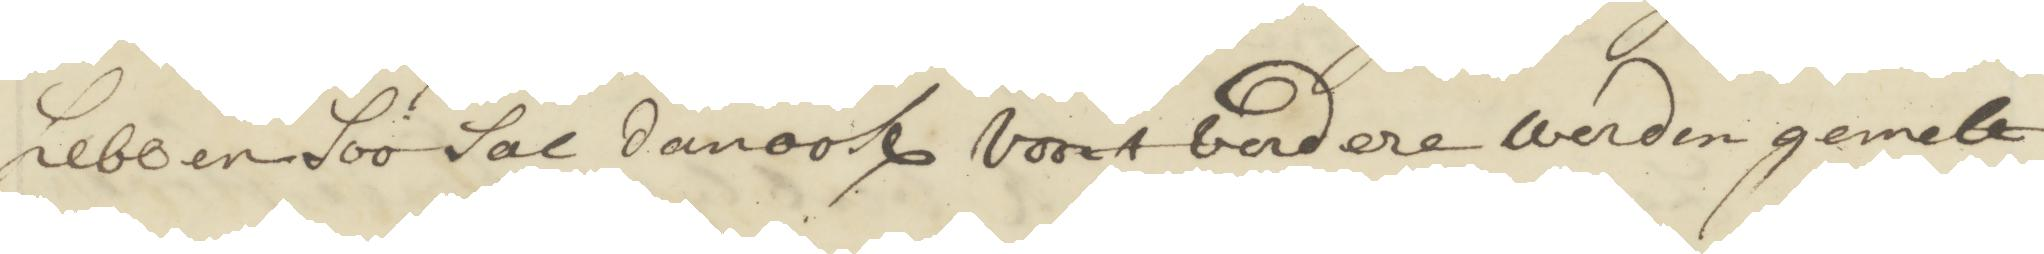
hebben soo sal danook voort verdere werden gemelt
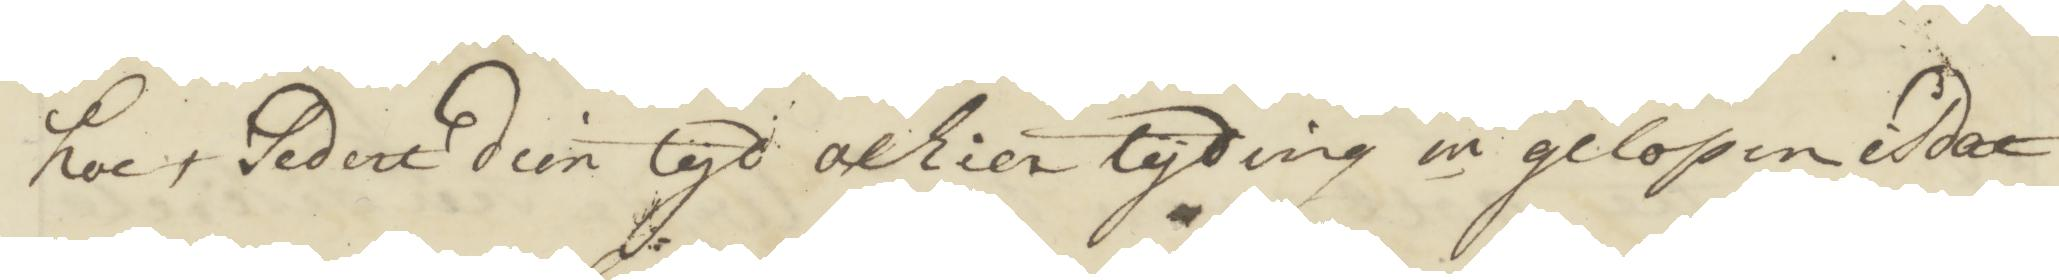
hoe t sedert dien tijd alhier tijding in gelopen is dat
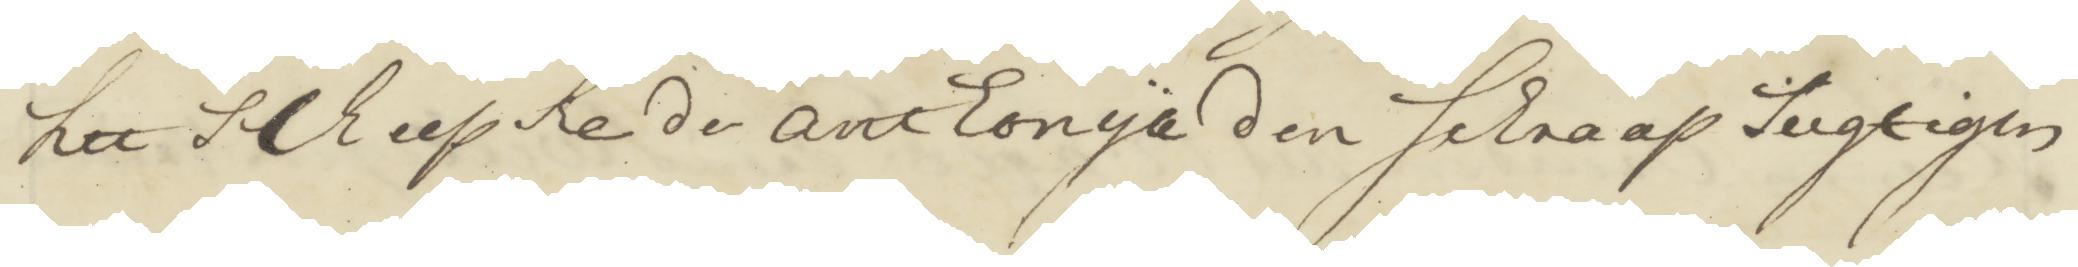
het scheepke de anthonija den schraap sugtigen
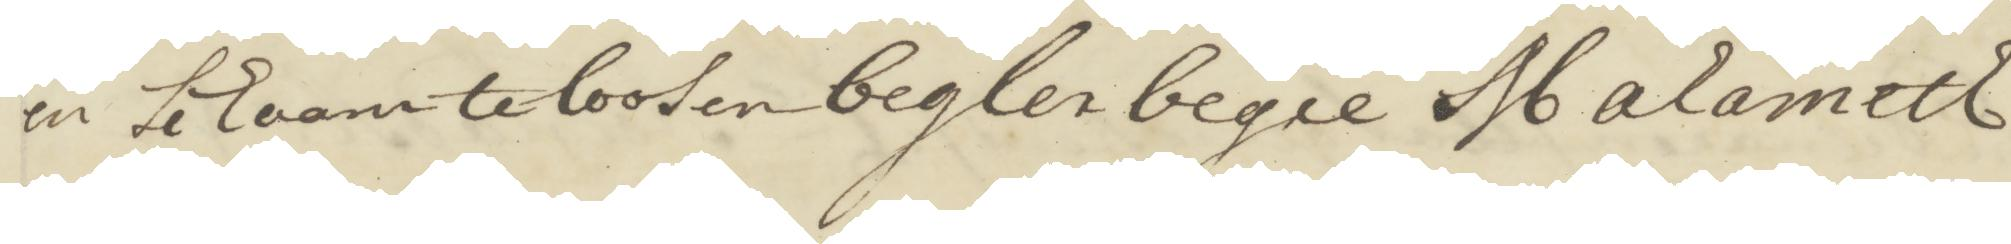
en schaam te loosen begler begie Malameth
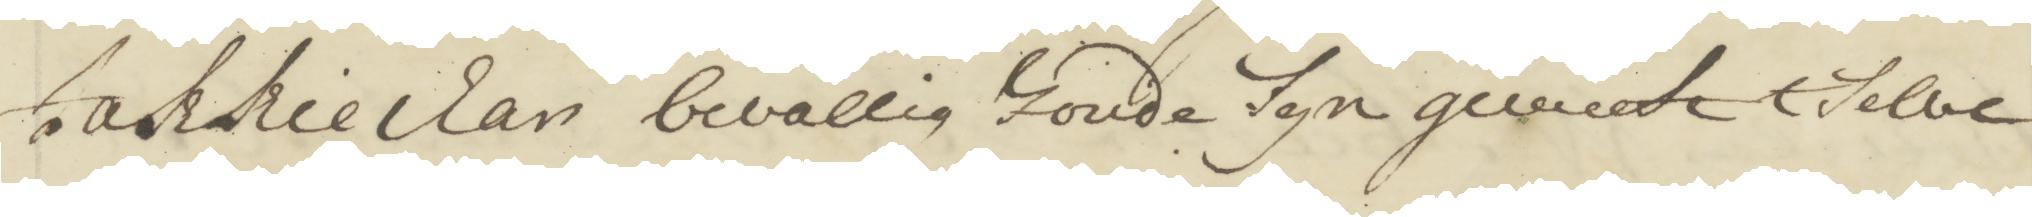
takkiechan bevallig zoude syn geweest t selve
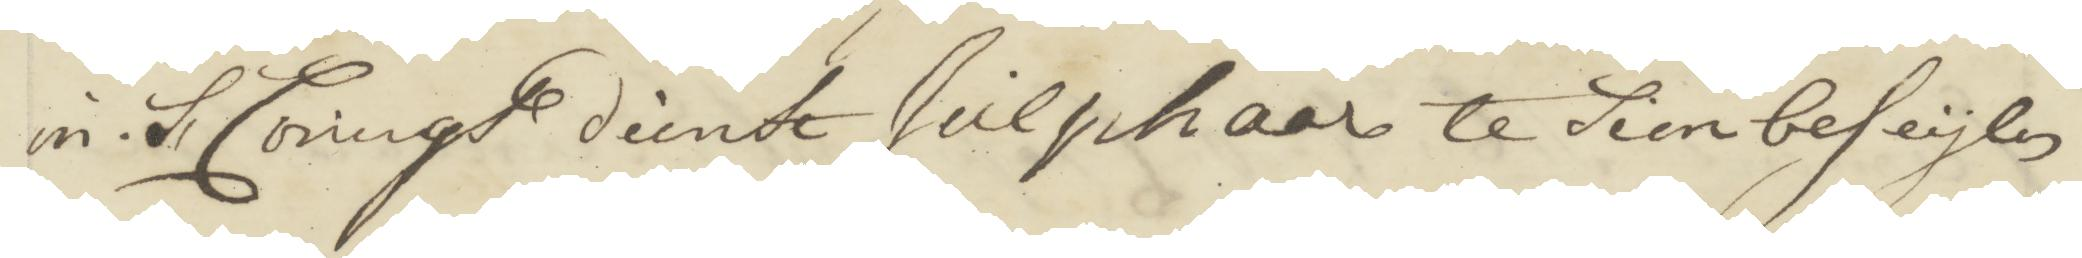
in s: Conings: dienst sulphaar te sien beseijlen
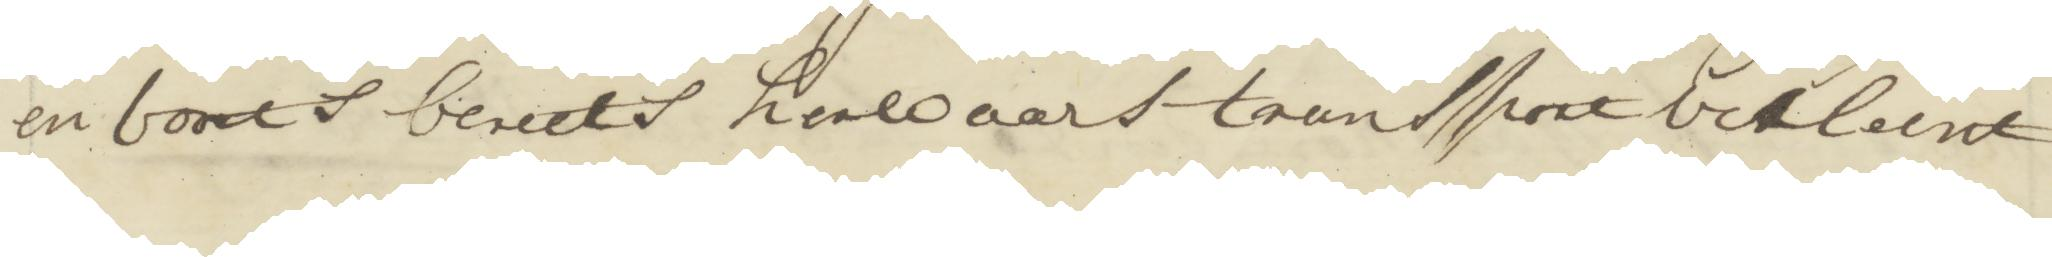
en voorts bereets herwaars transport verleent
